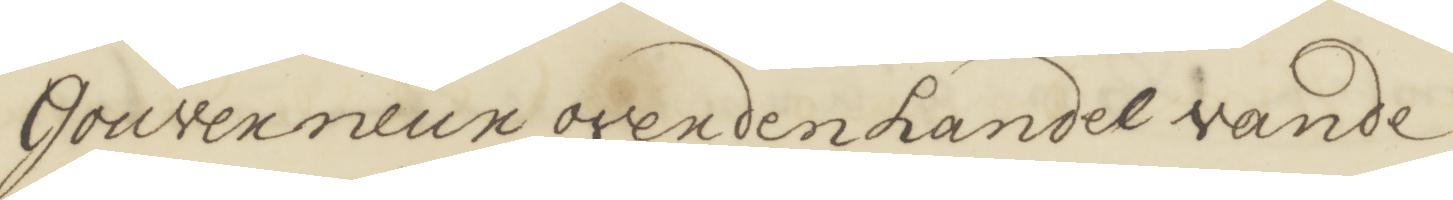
Gouverneur over den handel vande
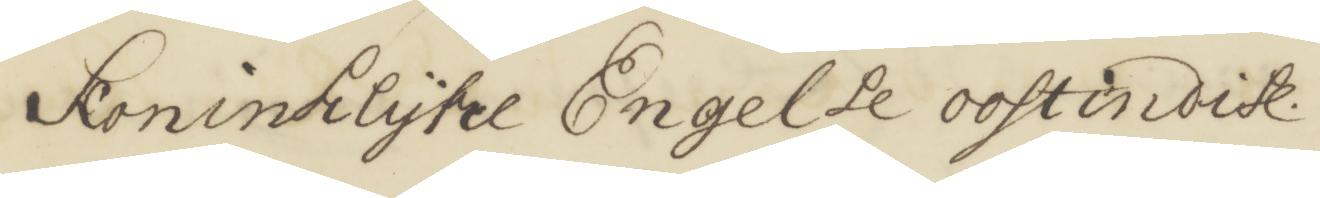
koninklijke Engelse oostindise
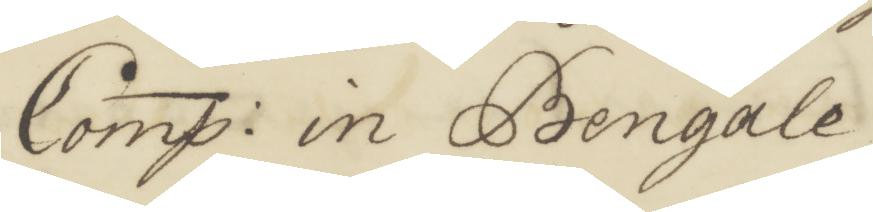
Comp: in Bengale
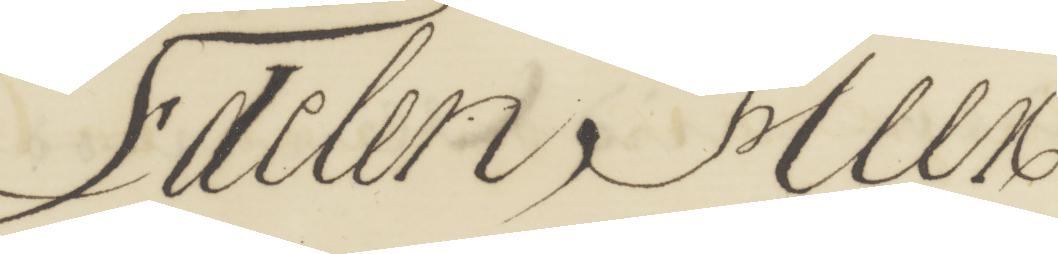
Edelen Heer
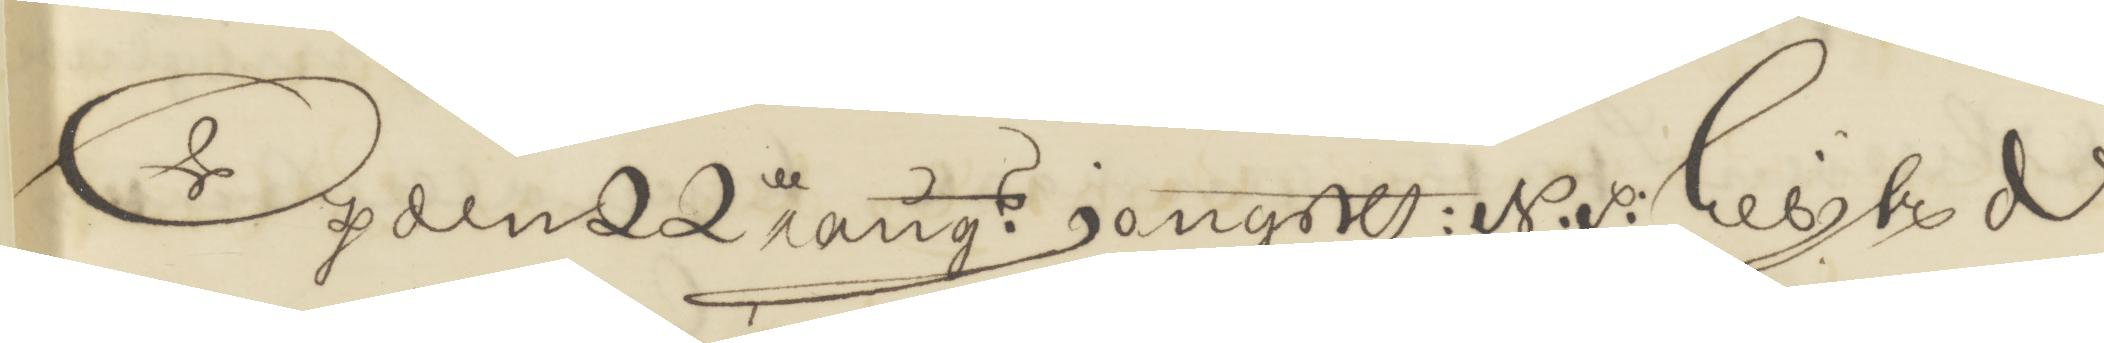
Op den 22„e aug.s jongstlijk: N.S: heb jk de
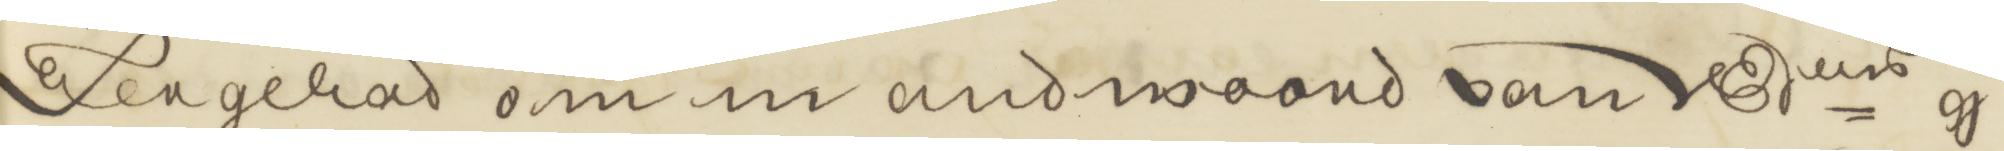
Eer gehad om in andwoord van VEd=ens g'
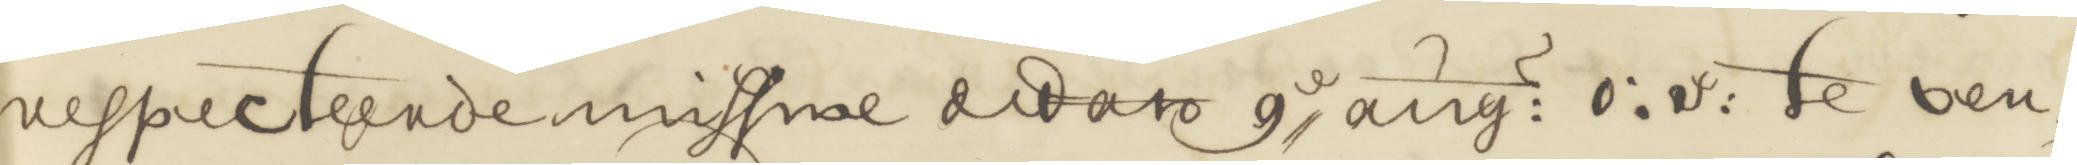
respecteerde missive de dato 9„e aug:s o:s: te ver„
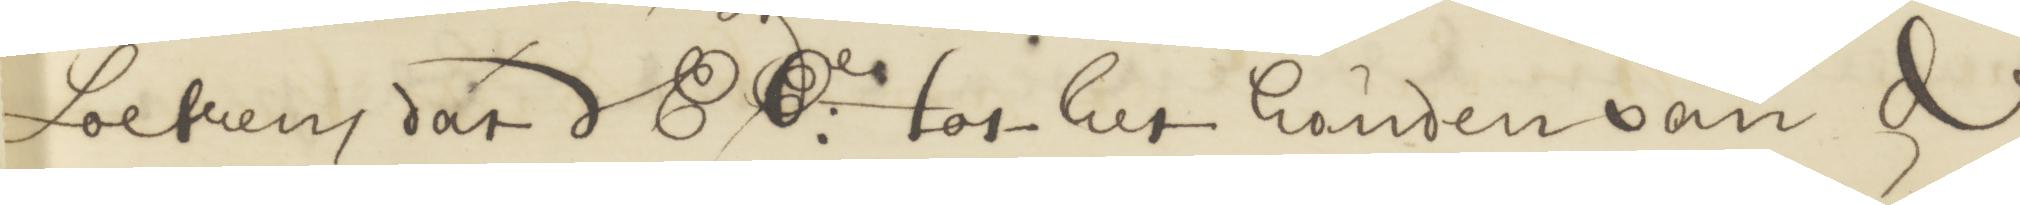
soeken, dat dE E:e tot het houden van de
